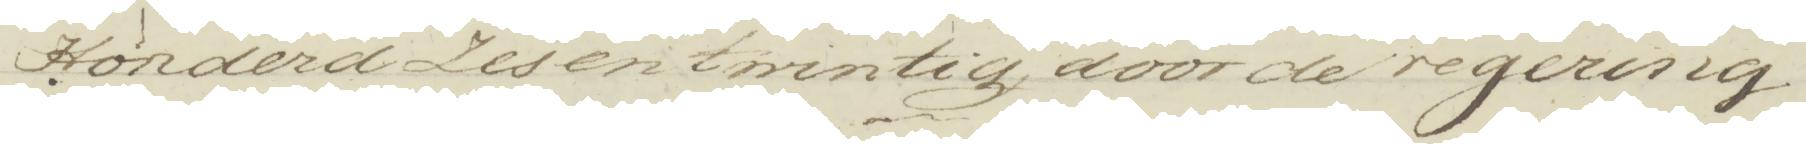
Honderd zes en twintig, door de regering
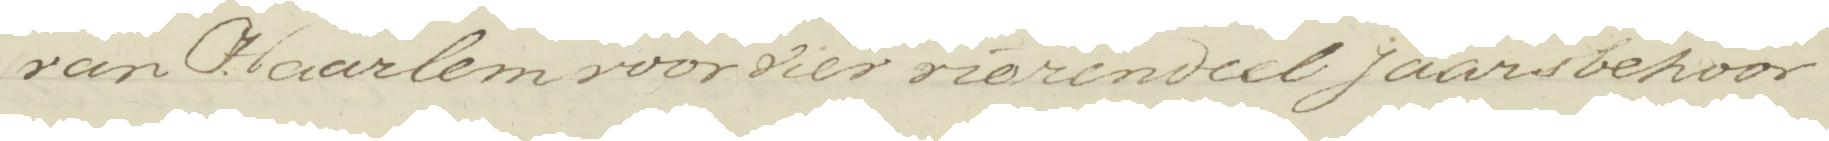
van Haarlem voor vier vierendeel Jaars behoor
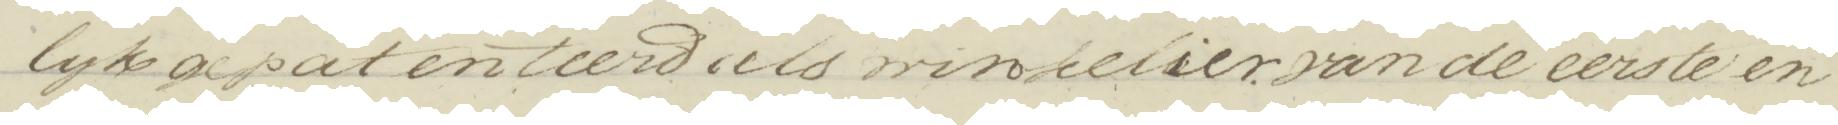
lyk gepatenteerd als winkelier van de eerste en
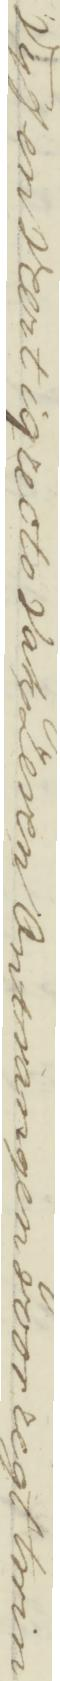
Vyf en veertig recto Vak Zeven Ontvangen voor regt twin
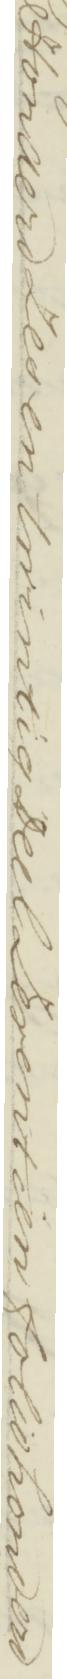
Honderd Zes en twintig deel Zeventien folio honderd
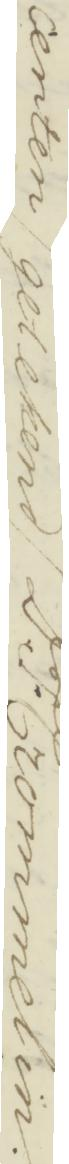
centen / getekend / D.F Crommelin.
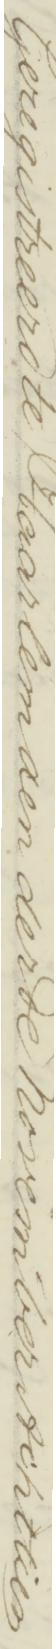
Geregistreerd te Haarlem den derde November Achttien
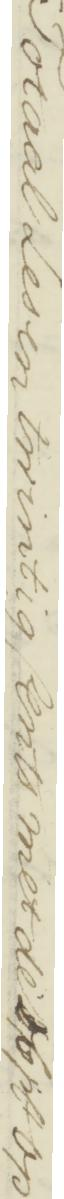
Totaal Zes en twintig Cents met de 26pCt op
